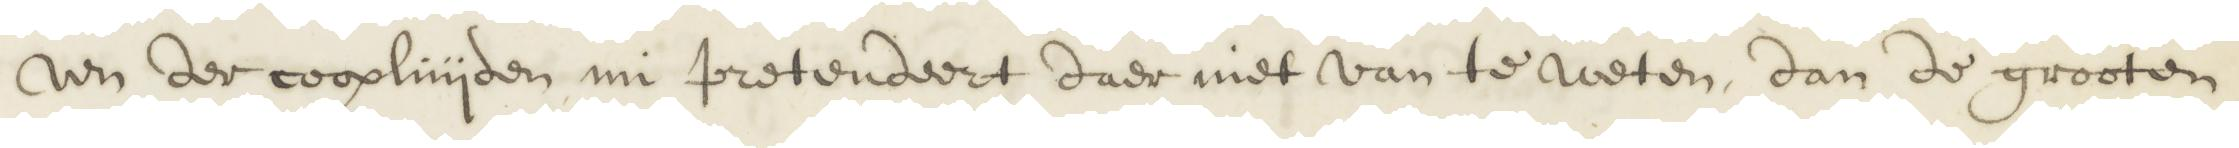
ven der coopluijden nu pretendeert daer niet van te weten, dan de grooten
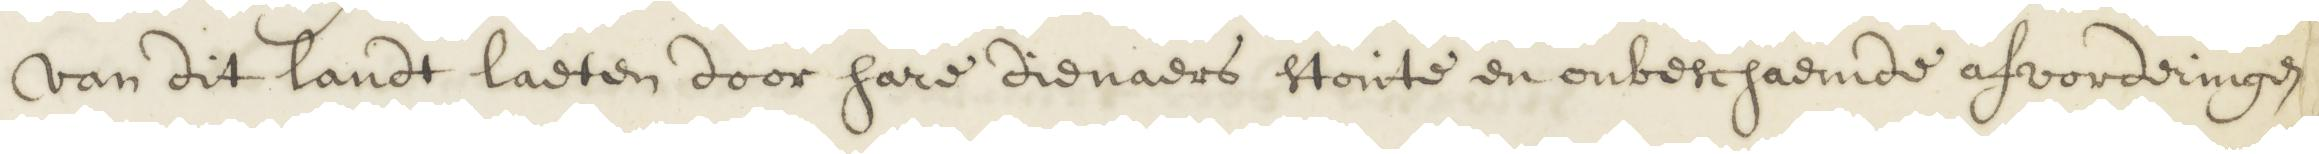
van dit landt laeten door hare dienaers stoute en onbeschaemde afvorderingen
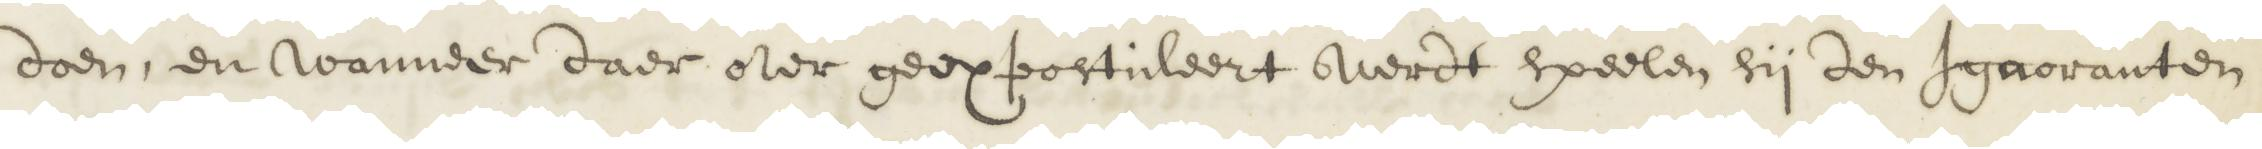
doen, en wanneer daer over geexpostuleert werdt speelen sij den jgnoranten
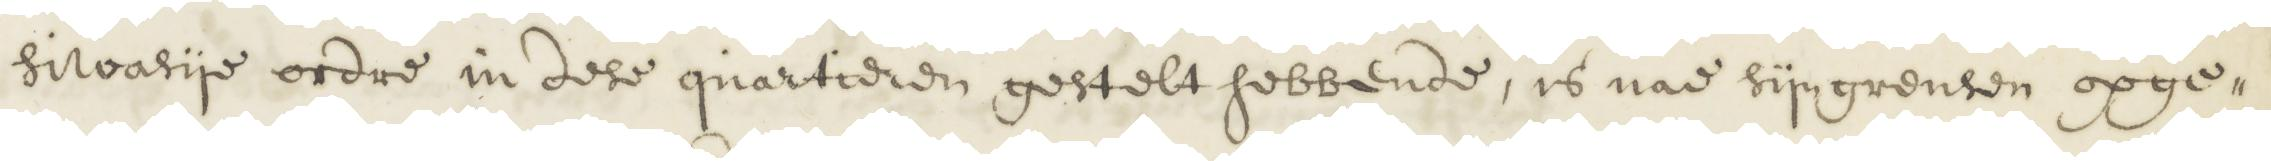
siwasije ordre in dese quartieren gestelt hebbende, is nae sijn grensen opge„
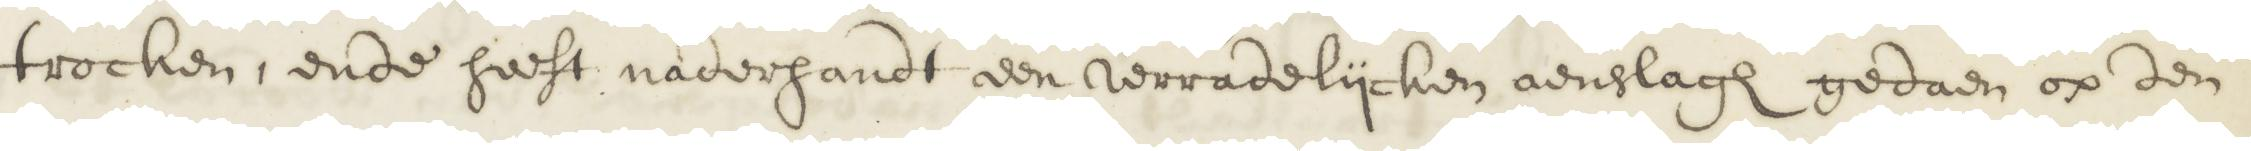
trocken, ende heeft naderhandt een verradelijcken aenslagh gedaen op den
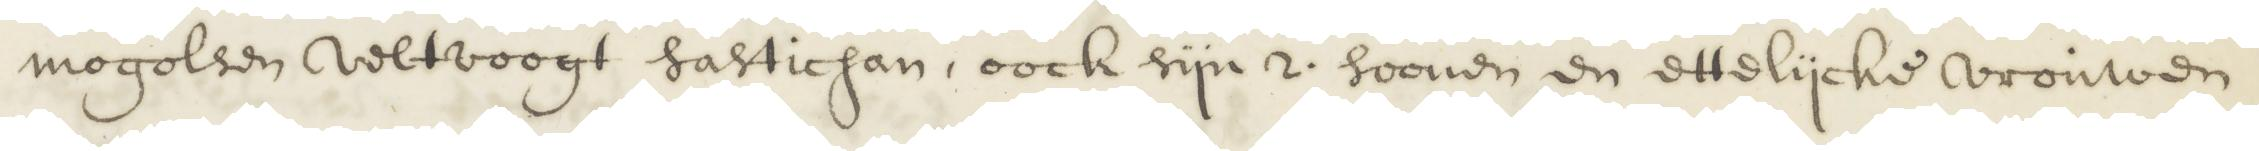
mogolsen veltvoogt sastichan, oock sijn 2. soonen en ettelijcke vrouwen
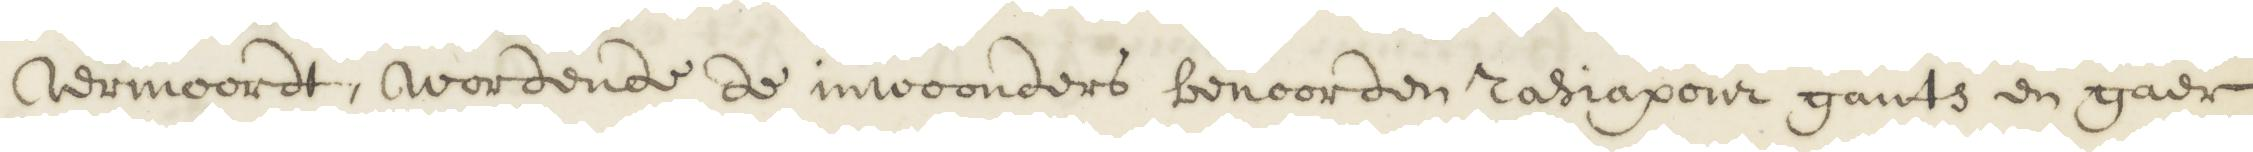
vermoordt, wordende de inwoonders benoorden rasiapour gants en gaer
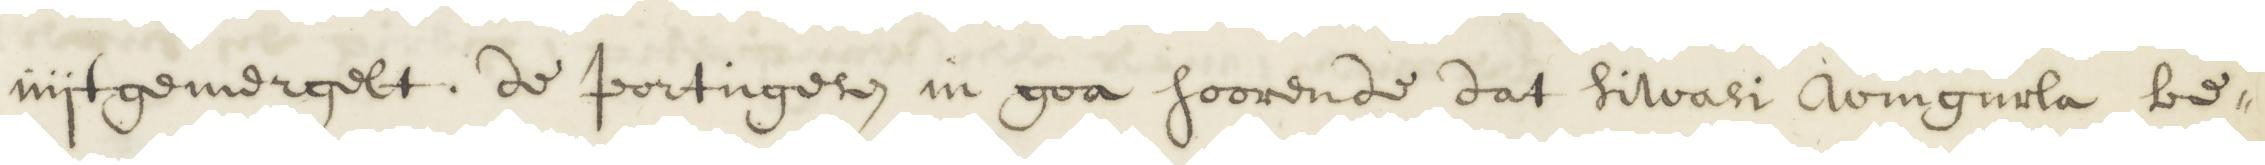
uijtgemergelt. De portugesen in goa hoorende dat siwasi wingurla be„
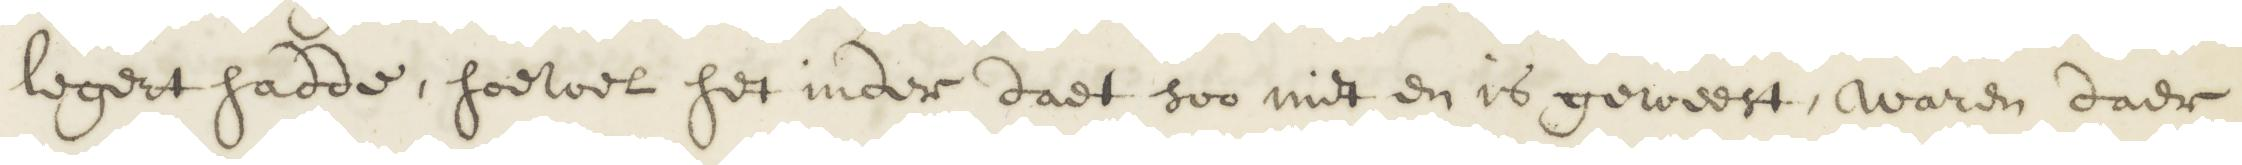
legert hadde, hoewel het inder daet soo niet en is geweest, waren daer
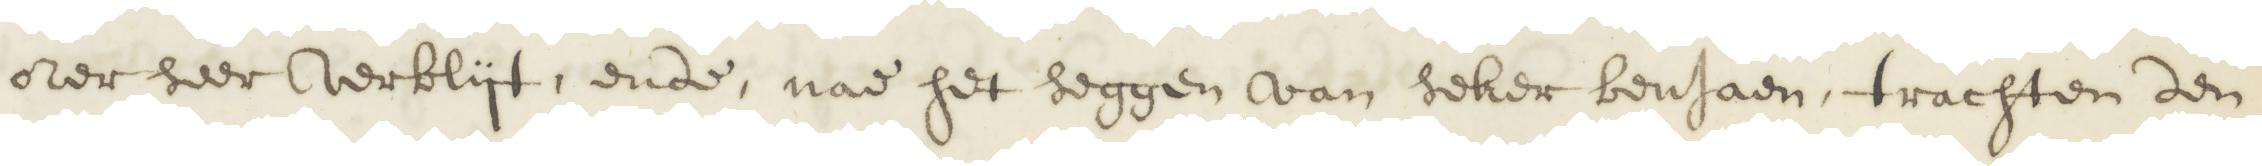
over seer verblijt, ende, nae het seggen van seker benjaen, trachten den
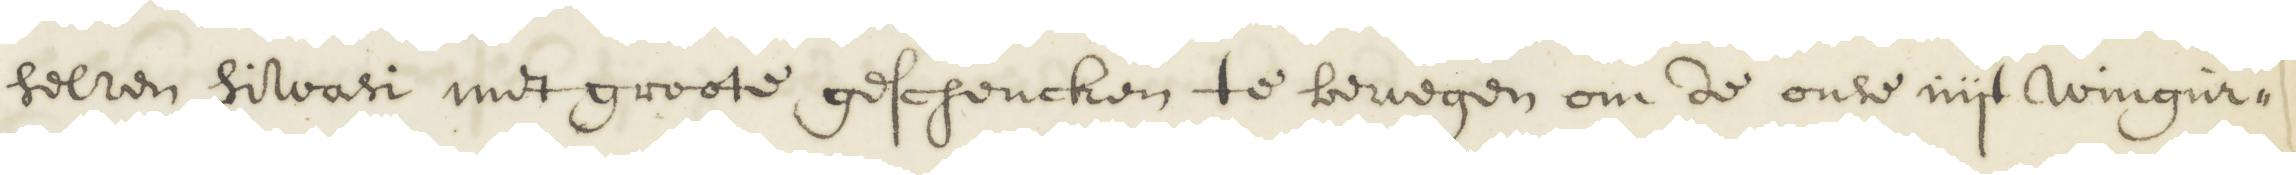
selven siwasi met groote geschencken te bewegen om de onse uijt wingur„
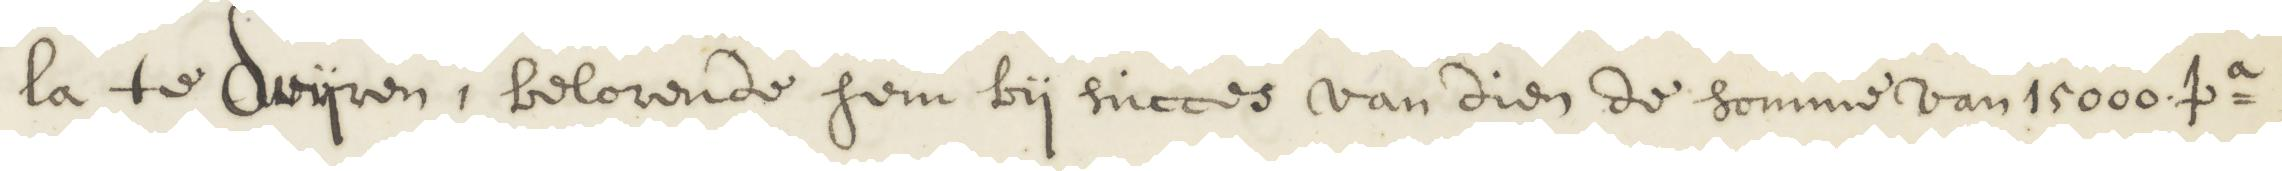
la te drijven, belovende hem bij succes van dien de somme van 15000. p=a
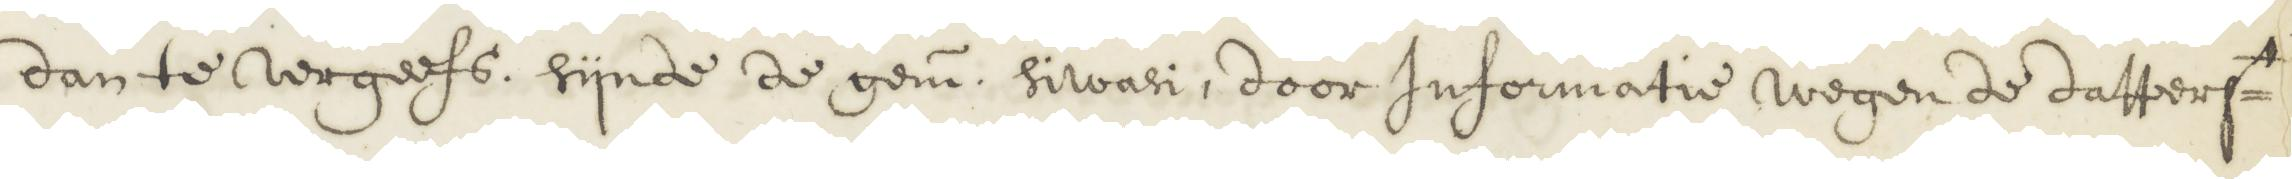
dan te vergeefs. sijnde de gem. siwasi, door jnformatie wegen de dapperh=t
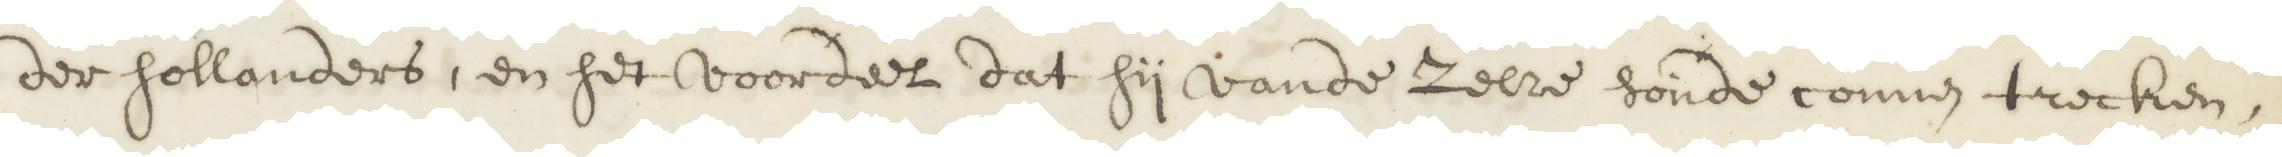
der hollanders, en het voordeel dat hij vande zelve soude connen trecken,
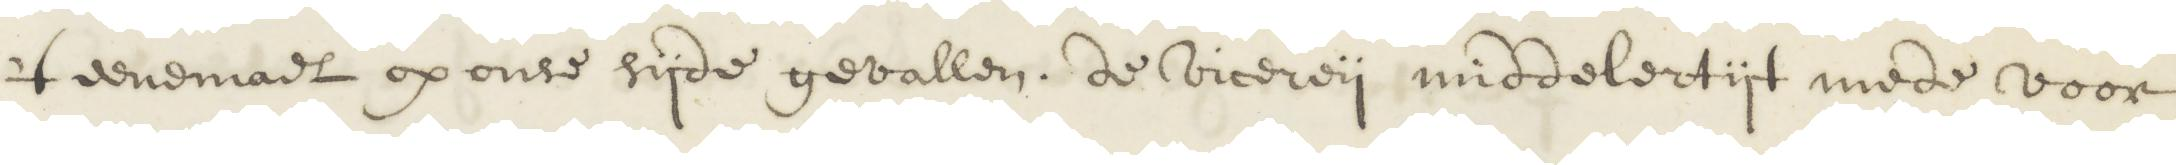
’t eenemael op onse sijde gevallen. De Vicereij middelertijt mede voor
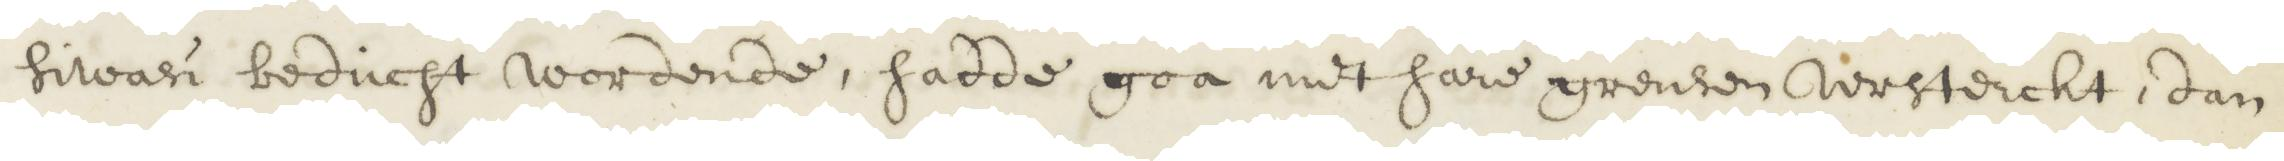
siwasi beducht wordende, hadde goa met hare grensen versterckt, dan
